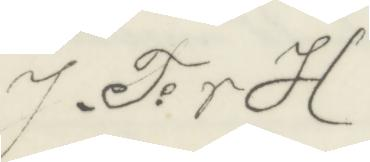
J.F. v H
